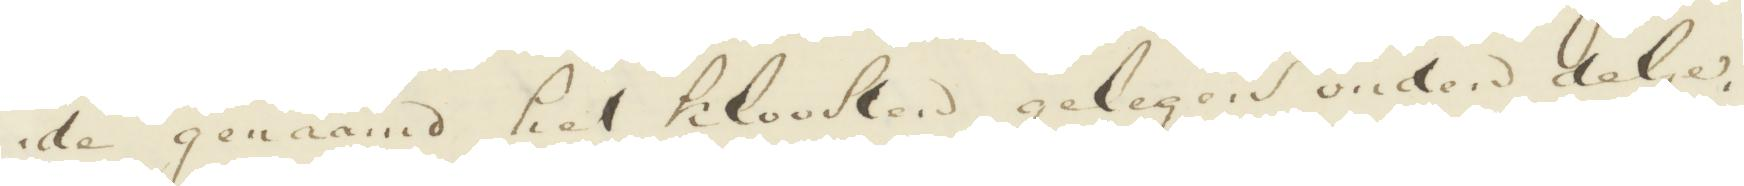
,de genaamd het klooster, gelegen onden de Ge,
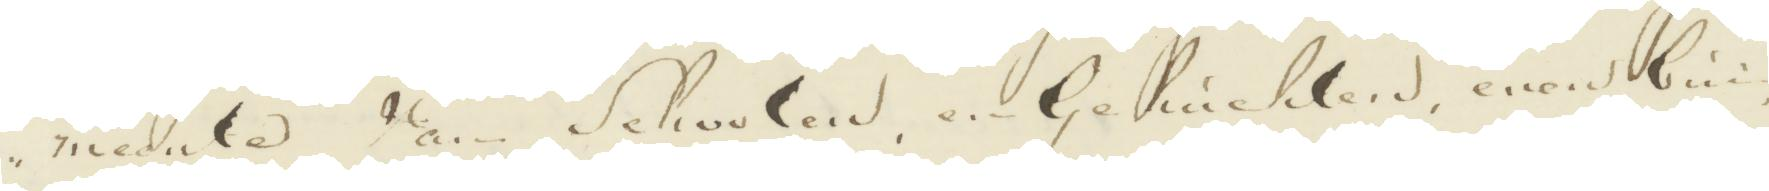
„meente Van Schooten, en Gehuchten, even bui
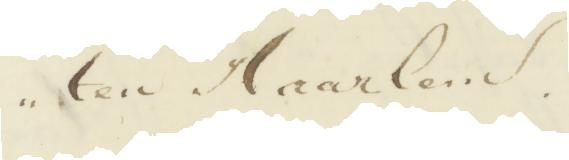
„ten Haarlem.
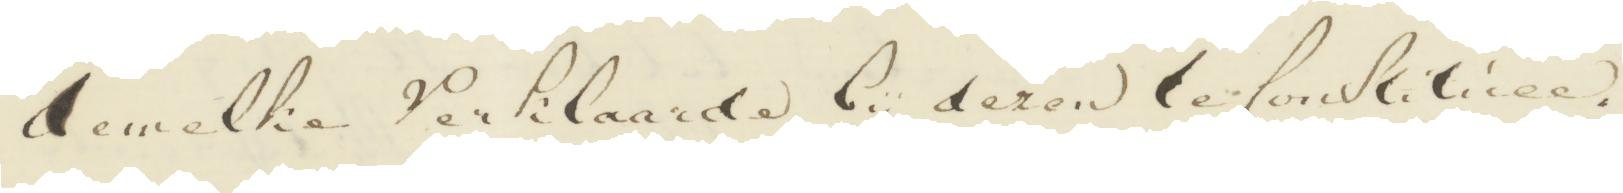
dewelke Verklaarde bij dezen te Constituee,
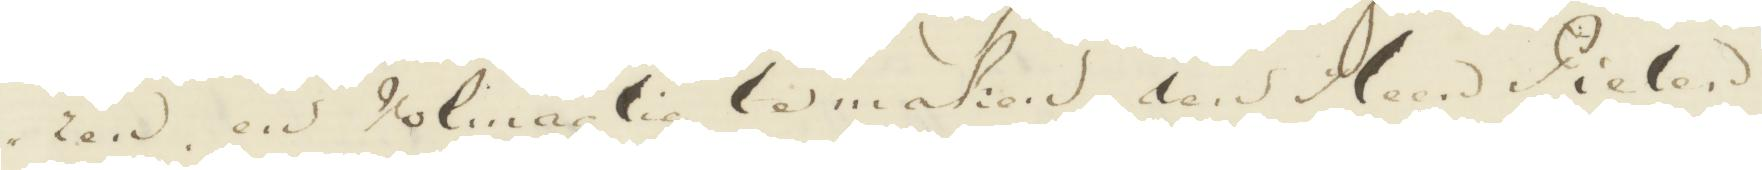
„ren, en Vomagtig te maken, den Heer Pieter
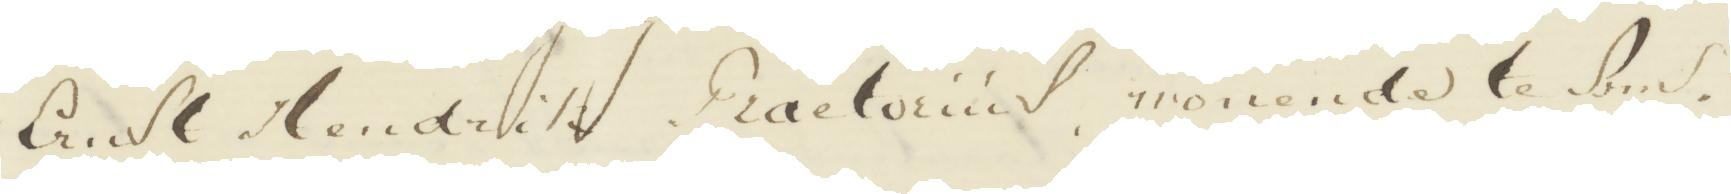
Ernst Hendrik Praetorius, wonende te Am,
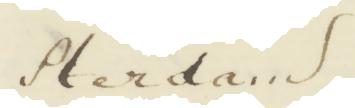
sterdam.
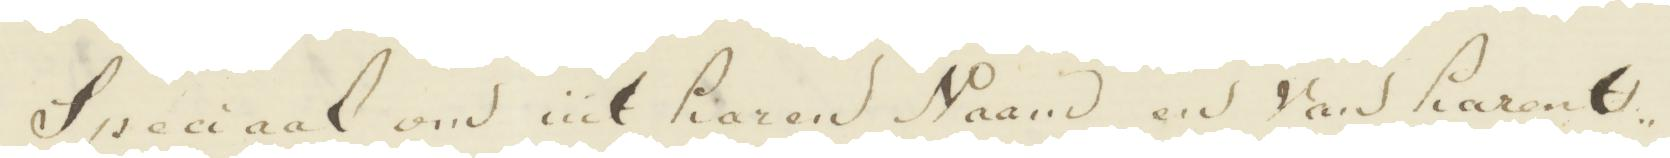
speciaal om uit haren Naam en van harent„
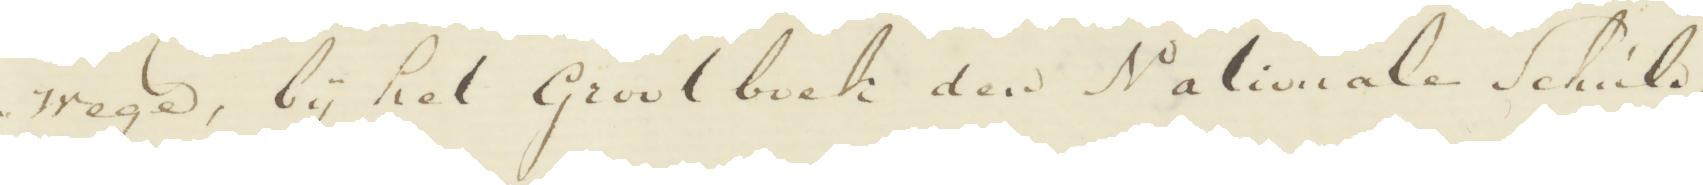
wege, bij het Groot boek der Nationale schuld
